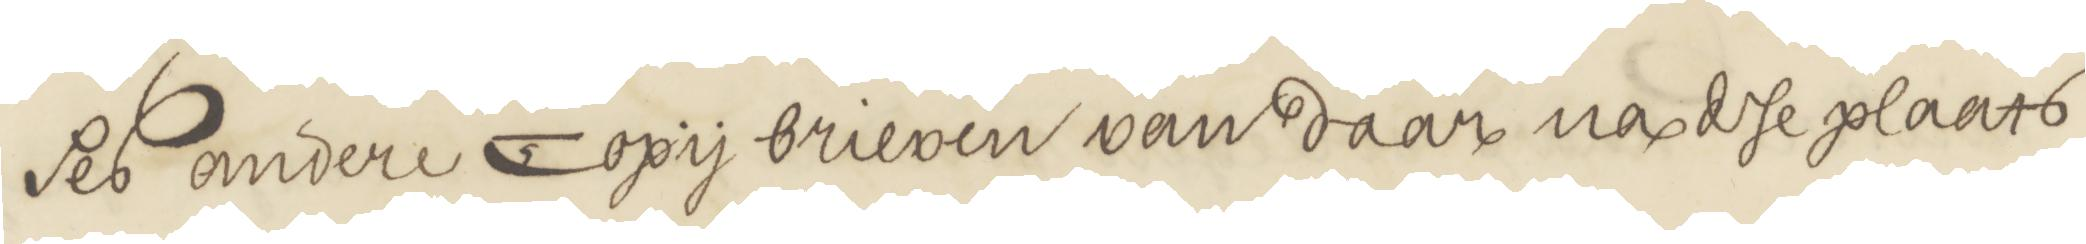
ses andere Copij brieven van daar na dese plaats
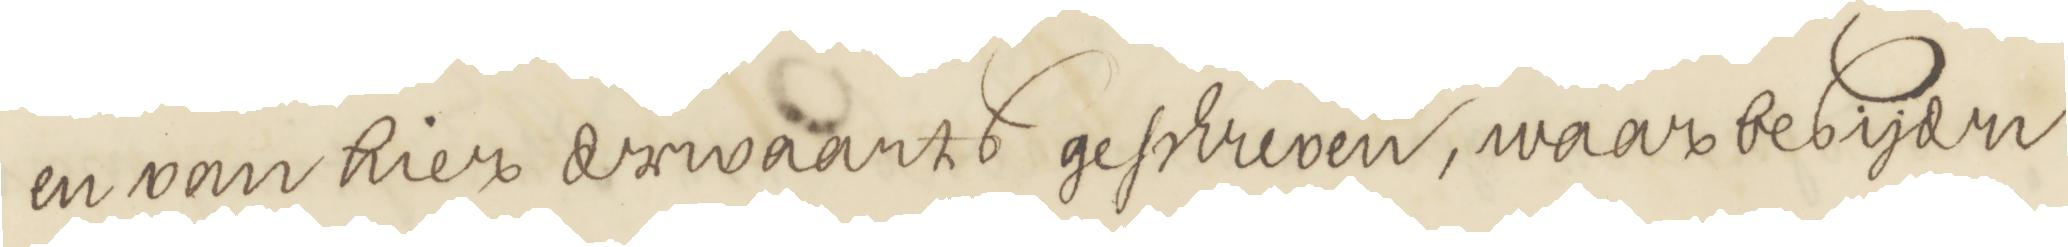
en van hier derwaarts geschreven, waar besijden
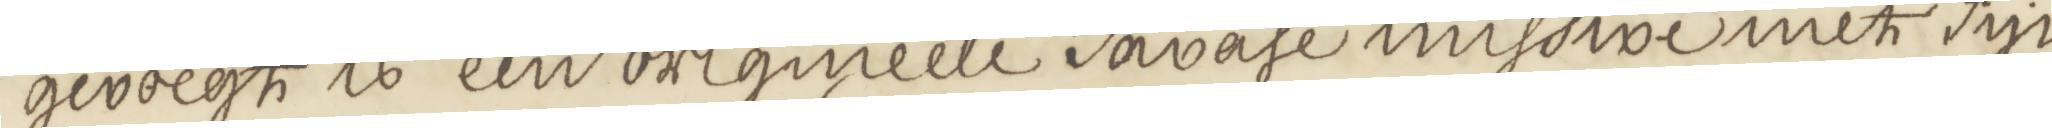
gevoegt is een origineele Javase missive met sijn
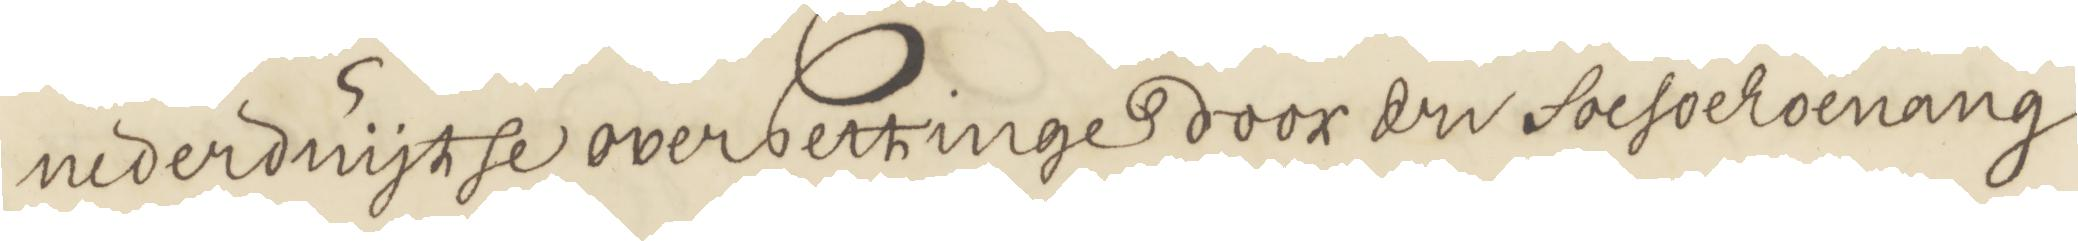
nederduijtse oversettinge door den soesoehoenang
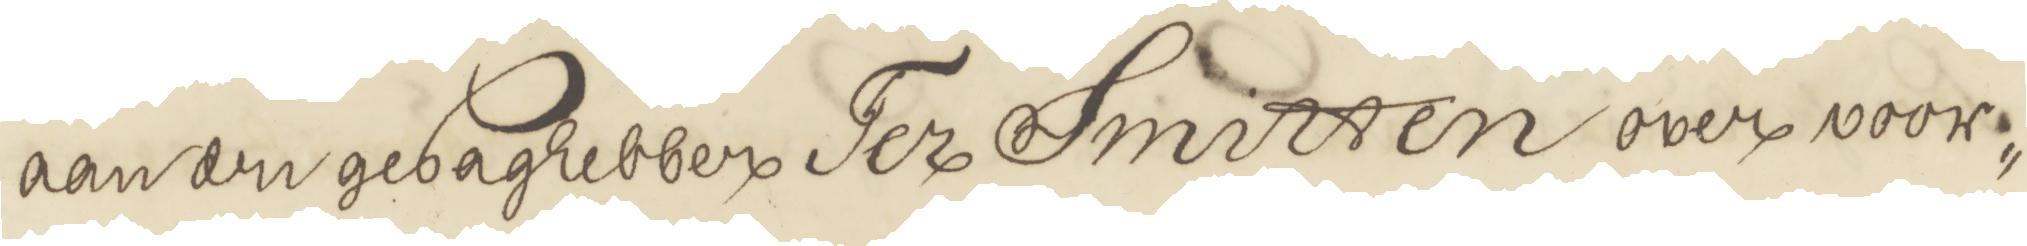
aan den gesaghebber Ter Smitten over voor„
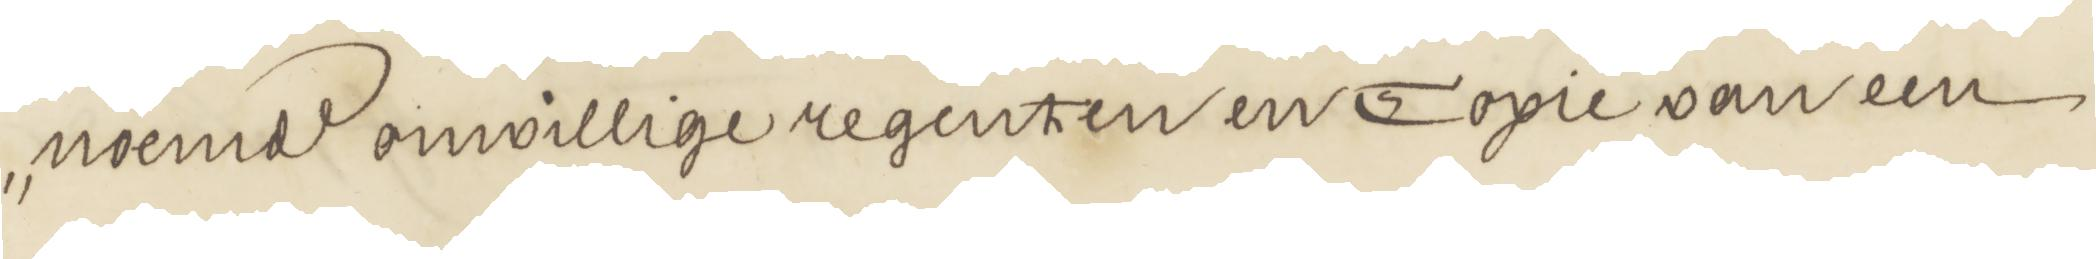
noemde onwillige regenten en Copie van een
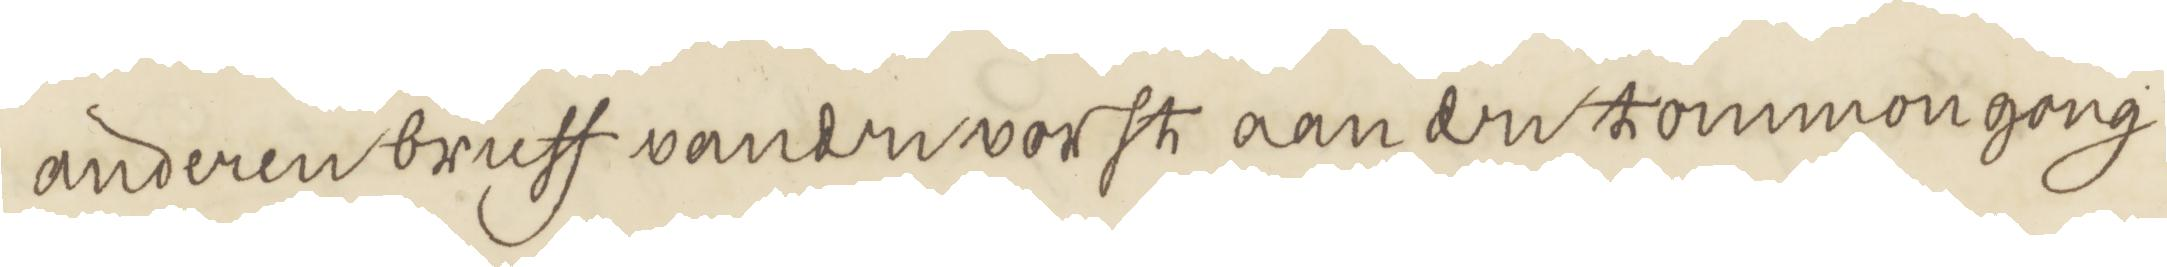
anderen brieff van den vorst aan den tommongong
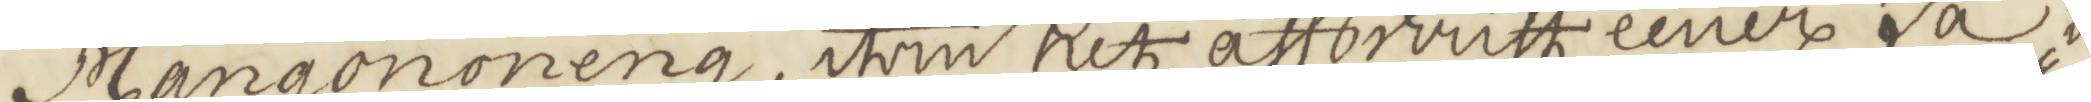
Mangononeng, item het affschrift eener Ja„
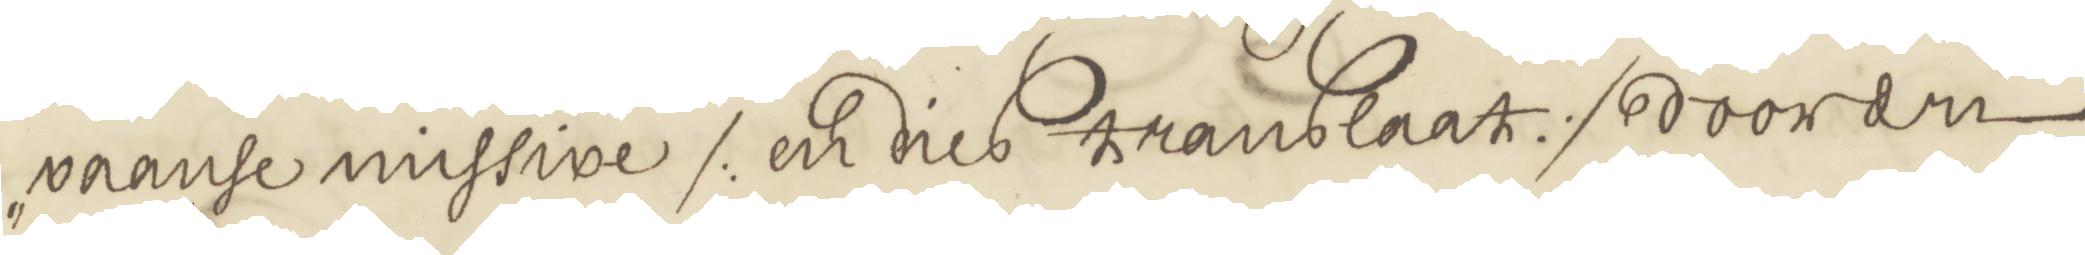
„vaanse missive /: en dies translaat:/ door den
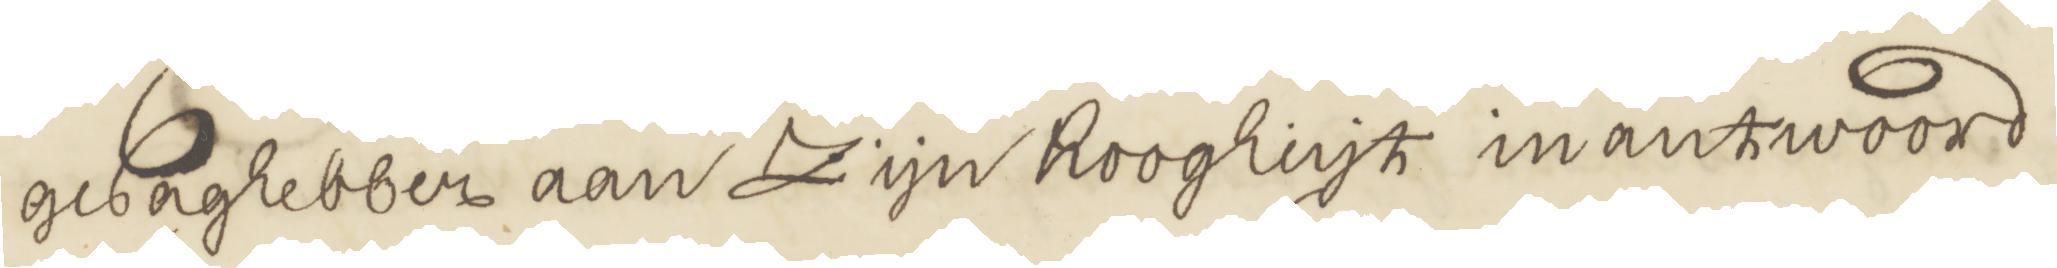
gesaghebber aan zijn hoogheijt in antwoord
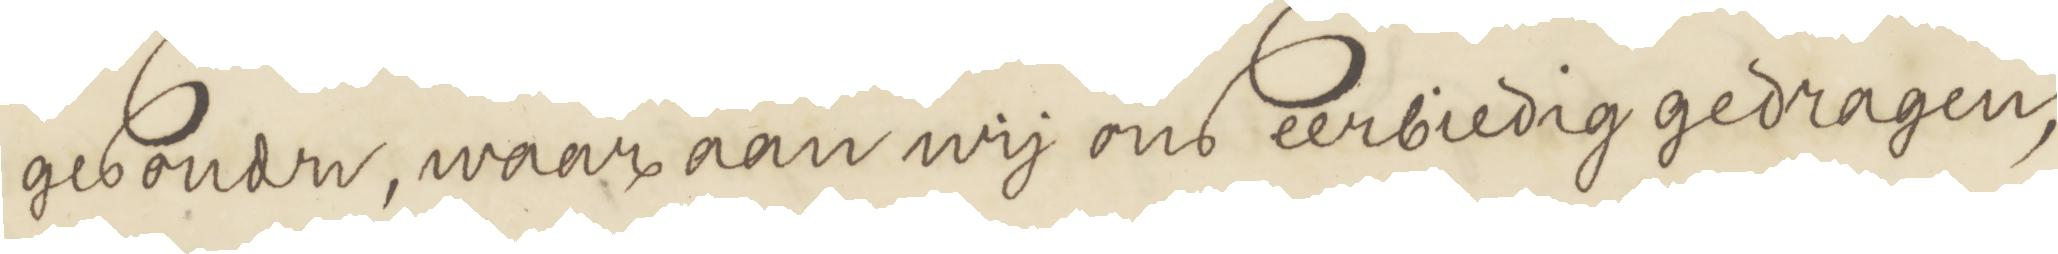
gesonden, waar aan wij ons eerbiedig gedragen,
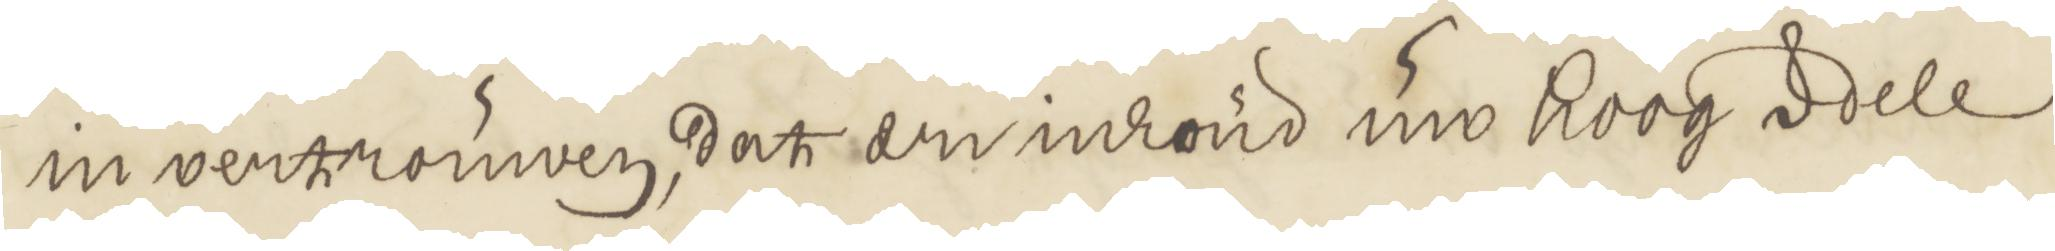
in vertrouwen, dat den inhoud uw hoog Edele
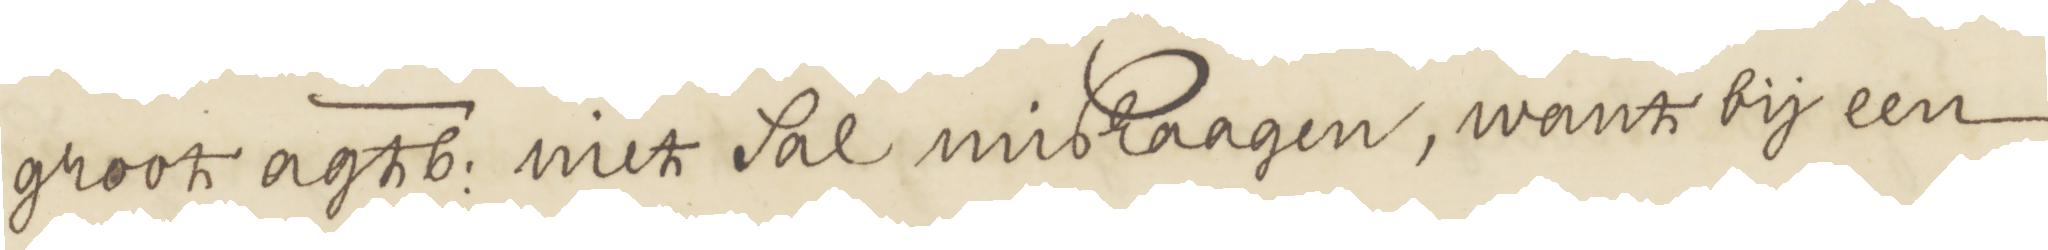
groot agtb: niet sal mishaagen, want bij een
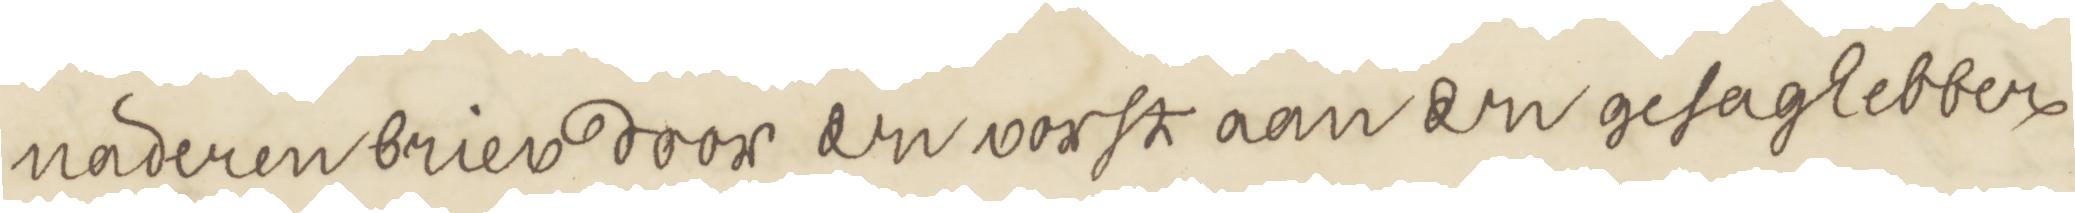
naderen briev door den vorst aan den gesaghebber
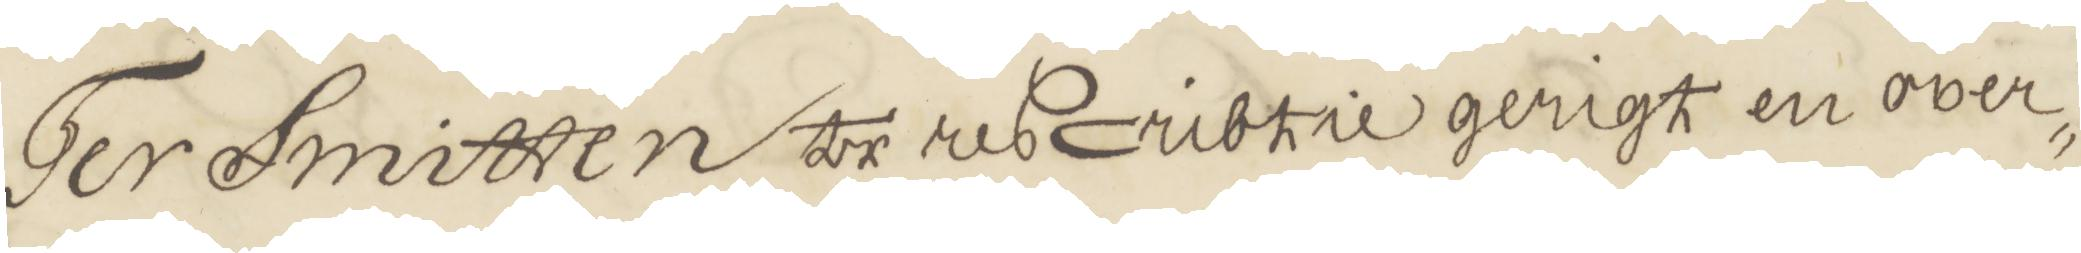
Ter Smitten ter rescribtie gerigt en over„
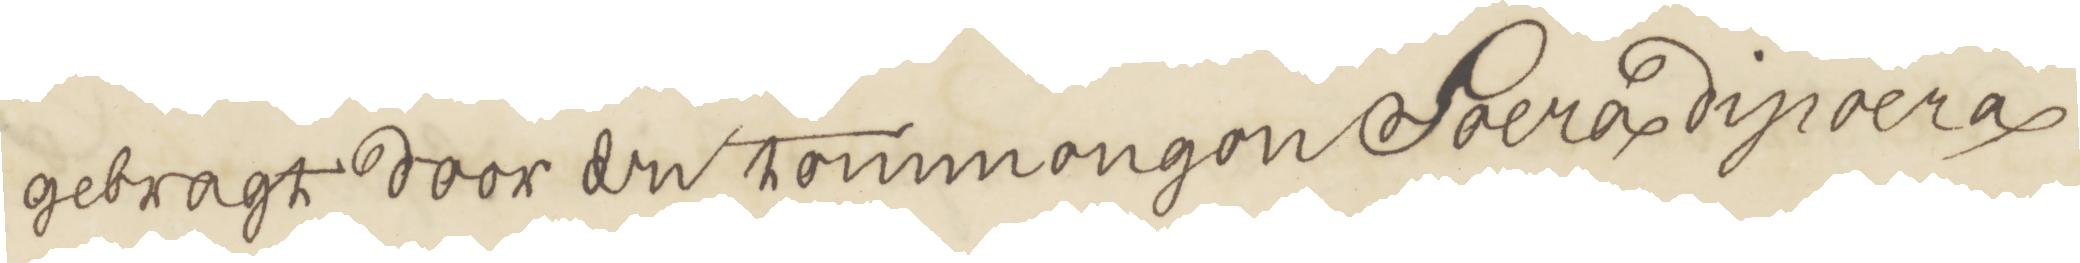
gebragt door den tommongon Soera dipoera
